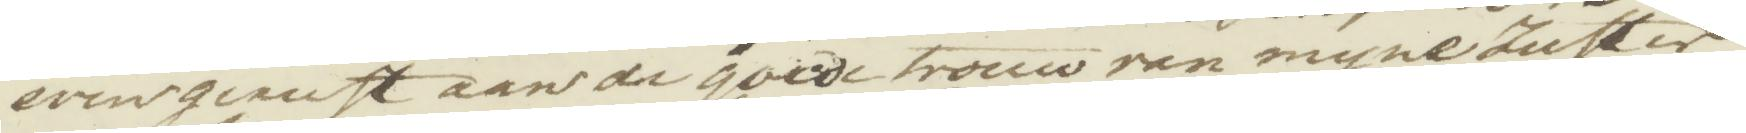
even gerieft aan de goede trouw van myne Zuster
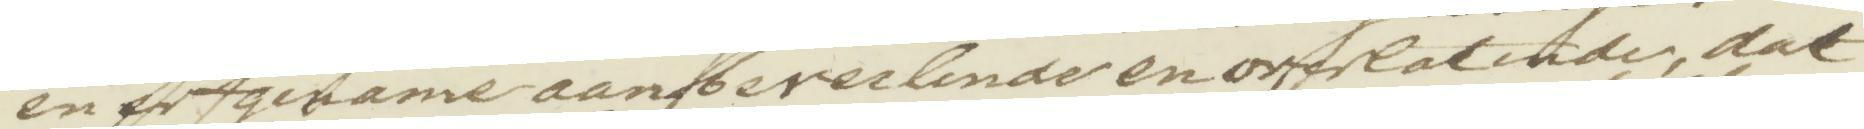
en erfgename aanbevelende en overlatende, dat
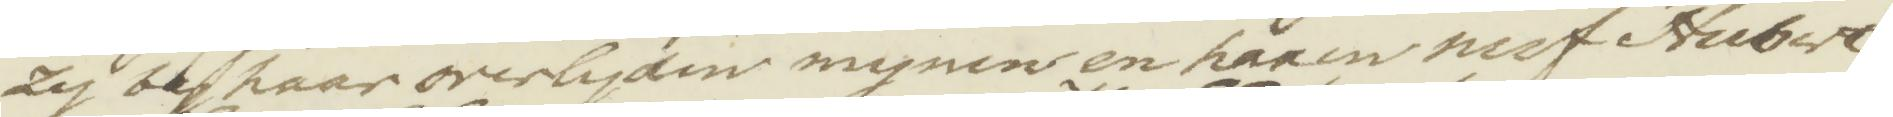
zy by haar overlyden mynen en haren neef Hubert
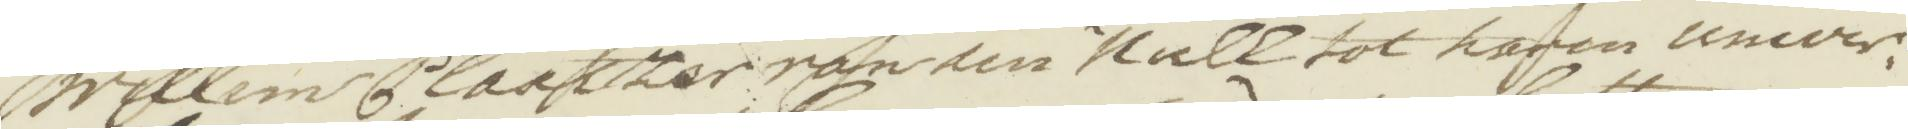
Willem Plaatzer van den Hull tot haren univer,
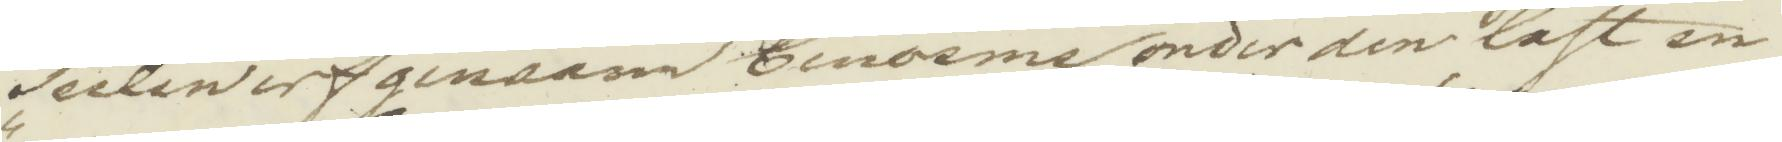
„seelen erfgenaam benoeme onder den last en
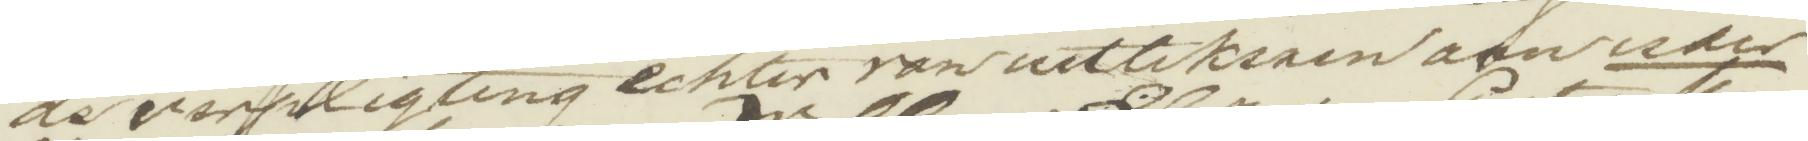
de verpligting echter van uittekeren aan ieder
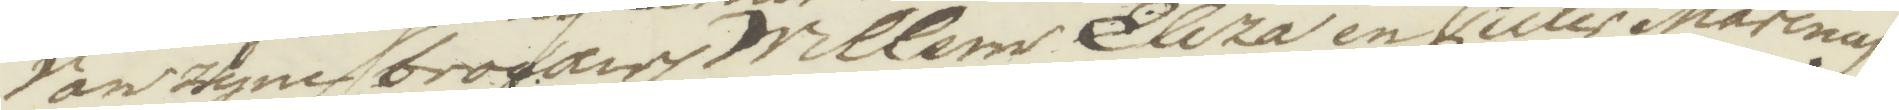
Van zyne broers Willem Eleza en Pieter Marinus
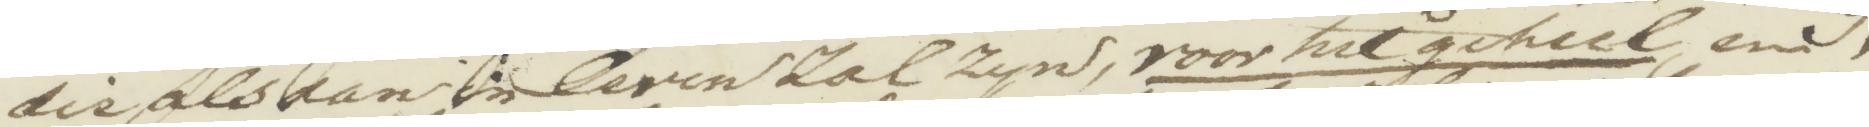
die als dan in leven zal zyn, voor het geheel en
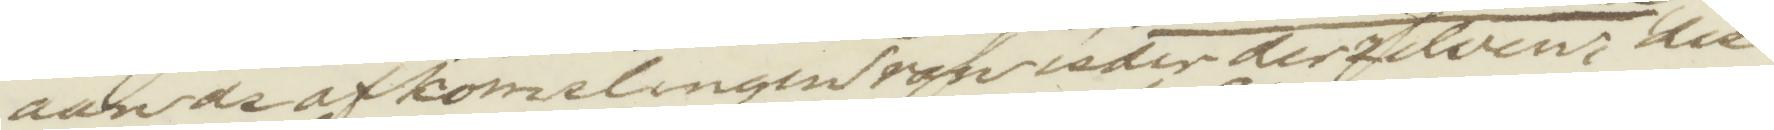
aan de afkomelingen van ieder derzelven, die
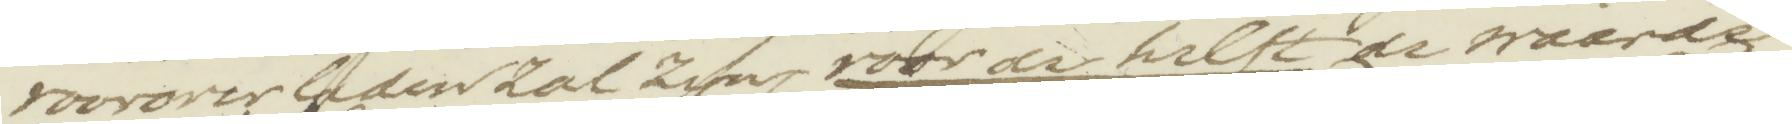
vooroverleden zal zyn, voor de helft de waarde
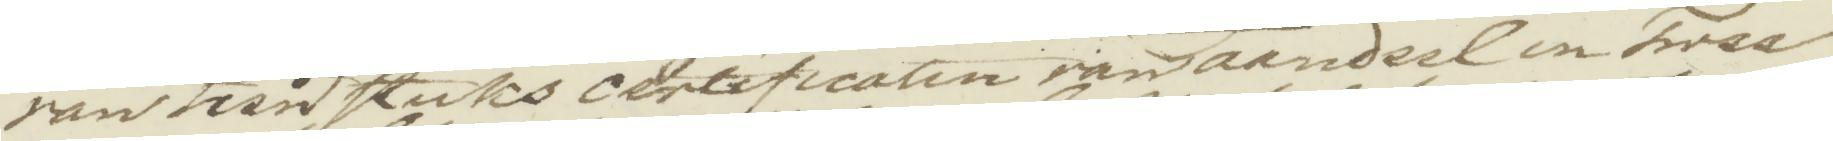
van tien stuks certificaten van aandeel en Twee
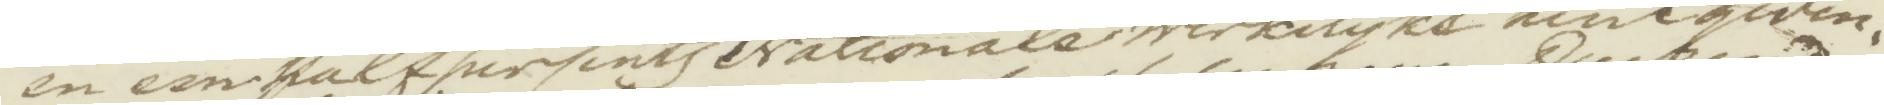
en een halfpercents Nationale werkelyke rentgeven,
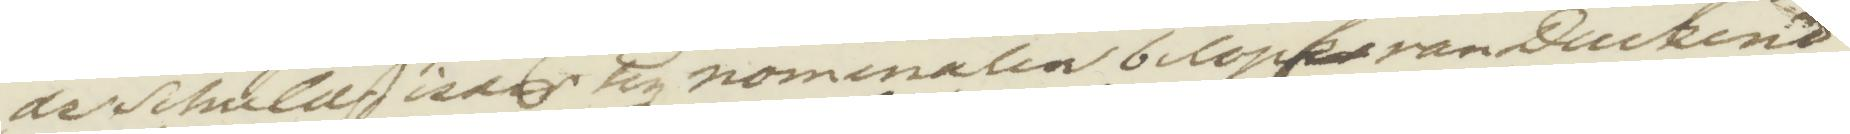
de schuld ieder ten nominalen belope van Duizend
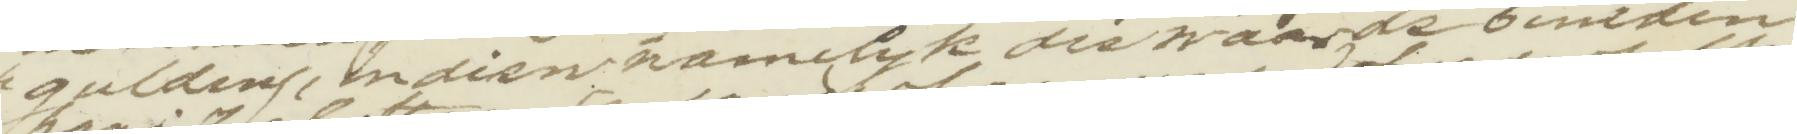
guldens, in dien namelyk die waarde beneden
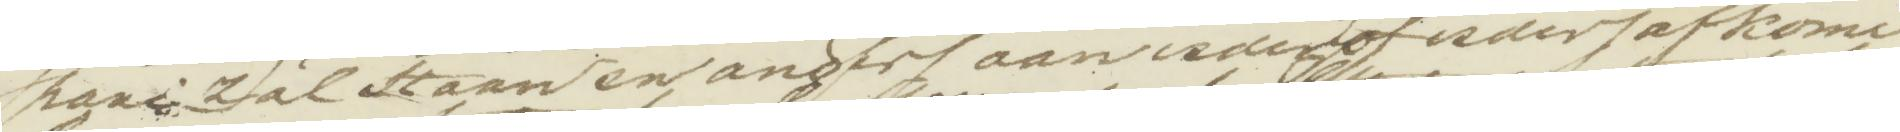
pari zal staan en anders aan ieder of ieders afkome,
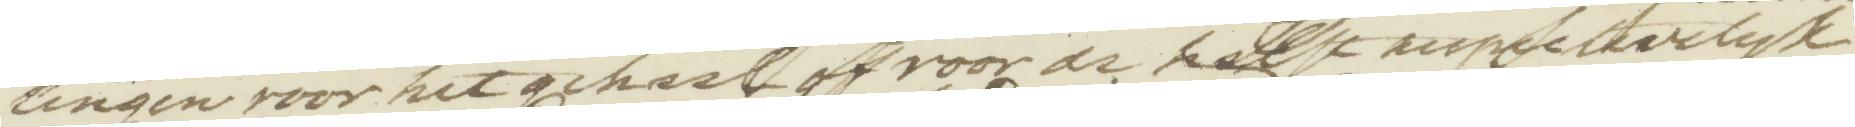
lingen voor het geheel of voor de helft respectivelyk
